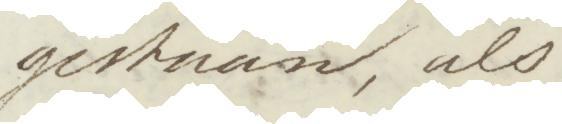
gestaan, als
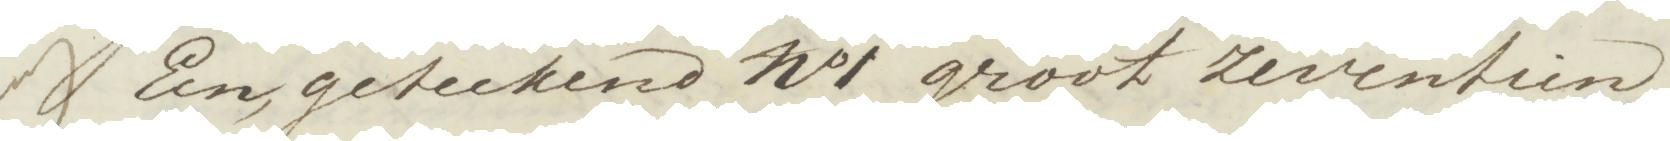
Een, geteekend N=o 1 groot zeventien
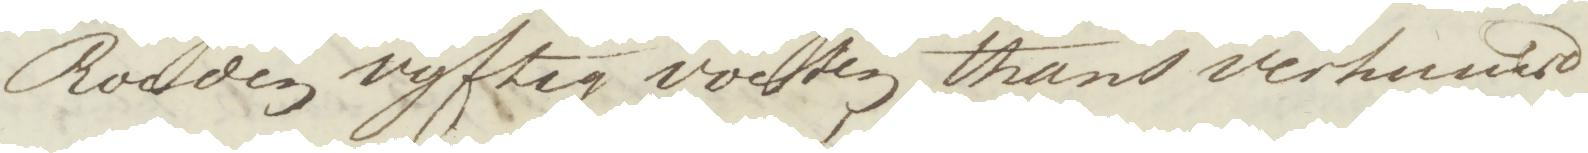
Roeden vijftig voeten, thans verhuurd
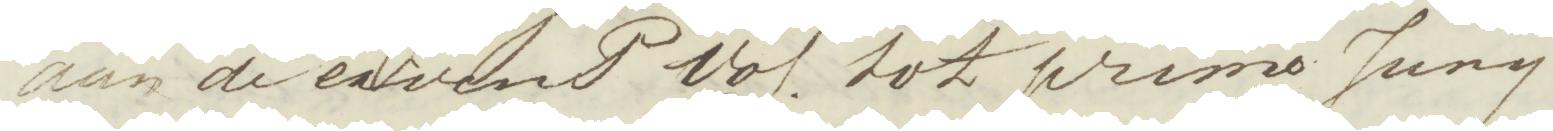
aan de ervens P Vos. tot primo Juny
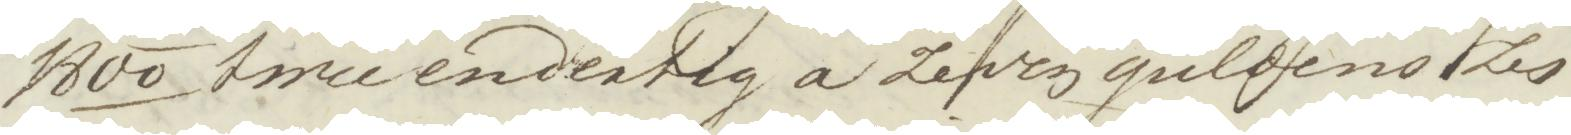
1800 twee endertig a zeven guldens zes
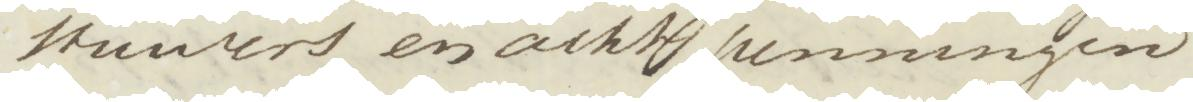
stuivers en acht penningen
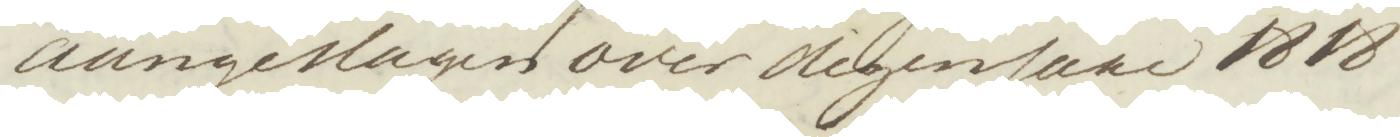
aangeslagen over dezen jare 1818
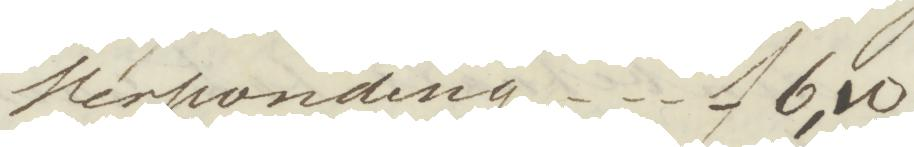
verponding - - - ƒ 6,10
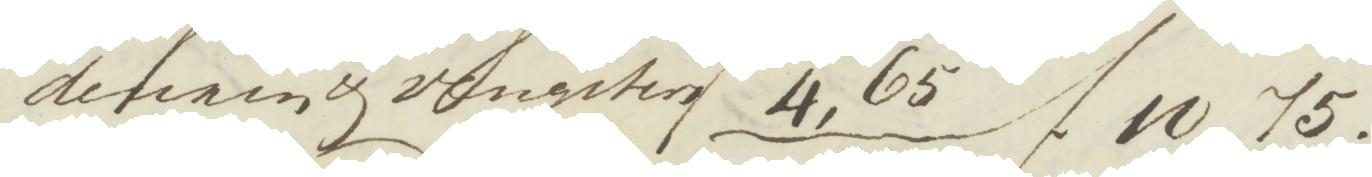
deuren & vengsters 4,65 ƒ 10,75.
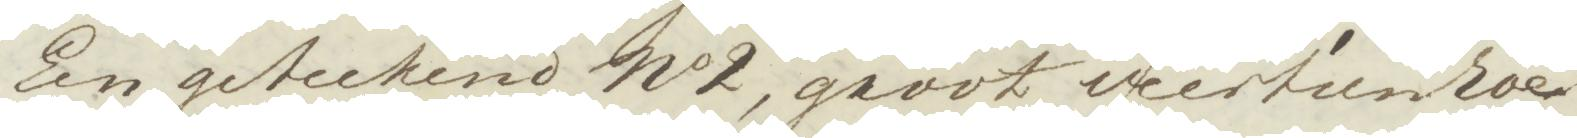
Een, geteekend No 2, groot veertien roe
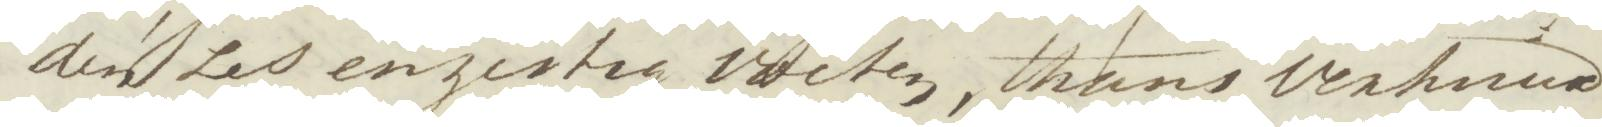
den zes enzestig voeten, thans verhuurd
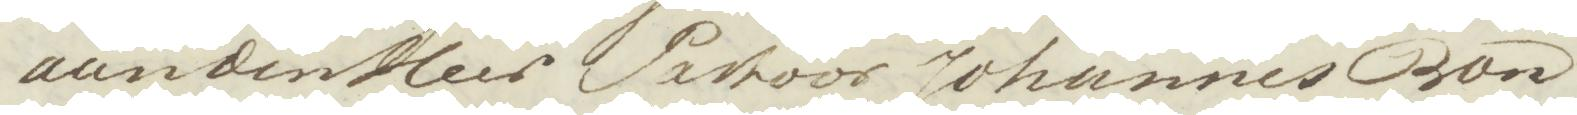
aan den Heer Pastoor Johannes Bon
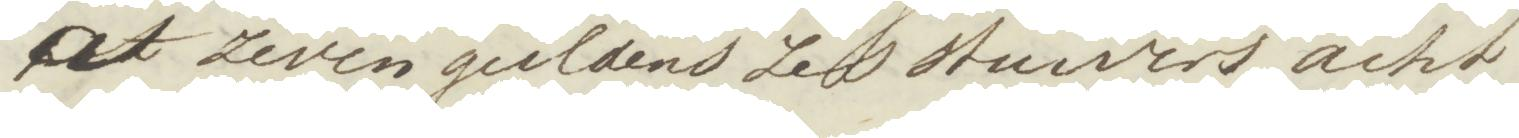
at zeven guldens zes stuivers acht
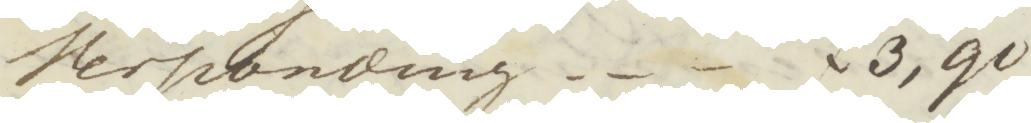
verponding - - - ƒ 3, 90
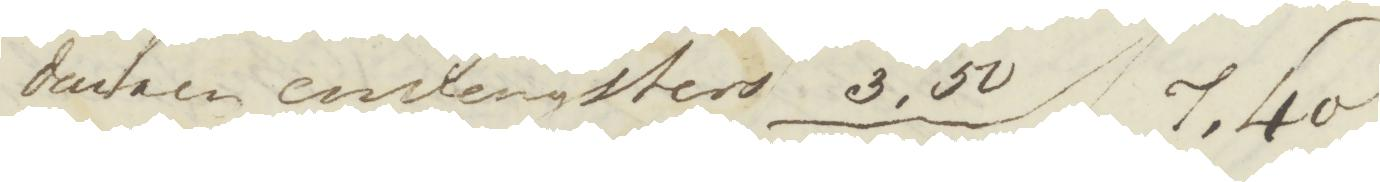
deuren en vengsters 3,50 .ƒ 7,40
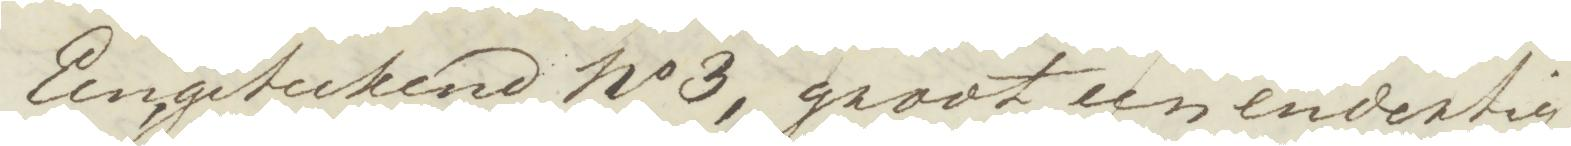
Een, geteekend No 3, groot een endertig
